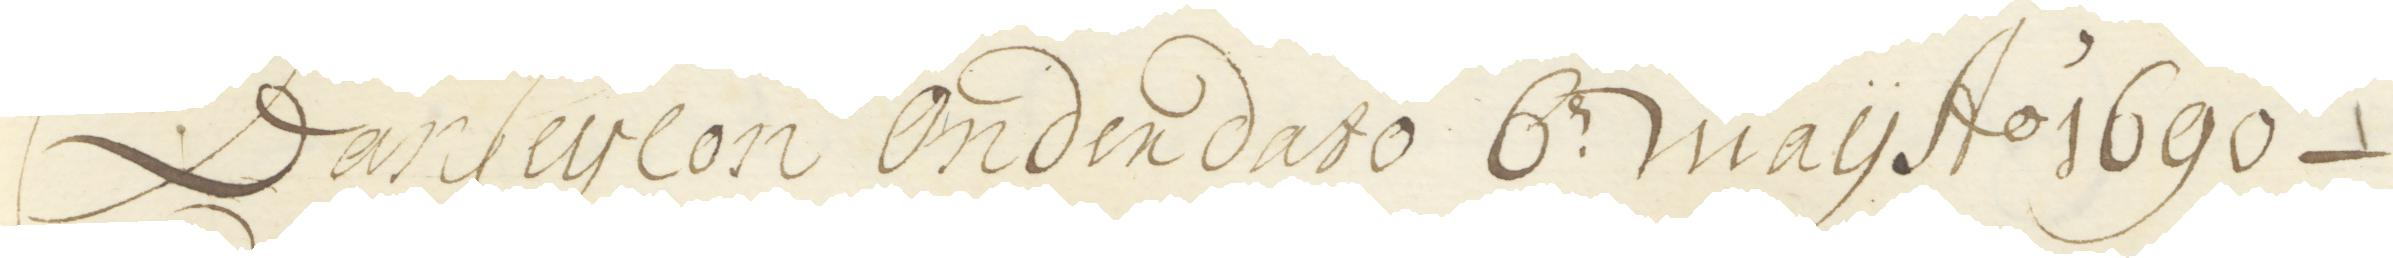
Van Ceijlon Onder dato 6.' maij Ao' 1690 —
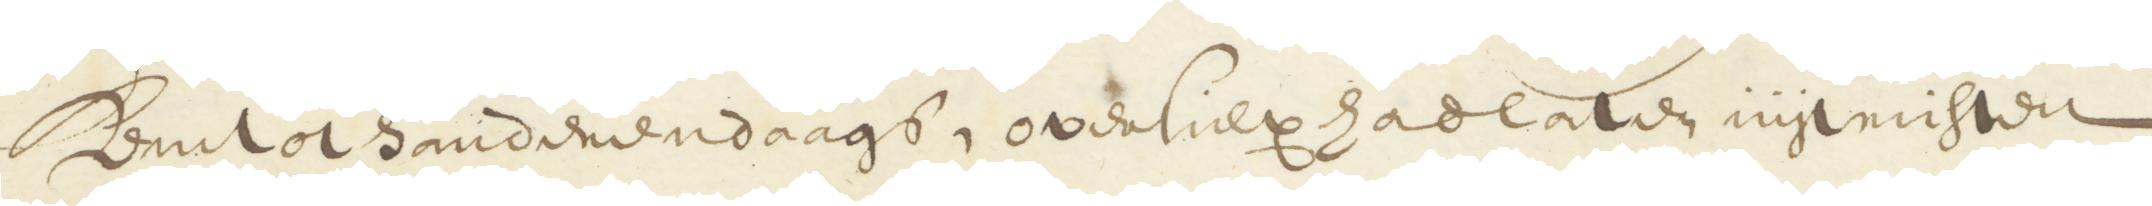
Hem tot sanderendaags, oversulx hadlaten uijtmisten
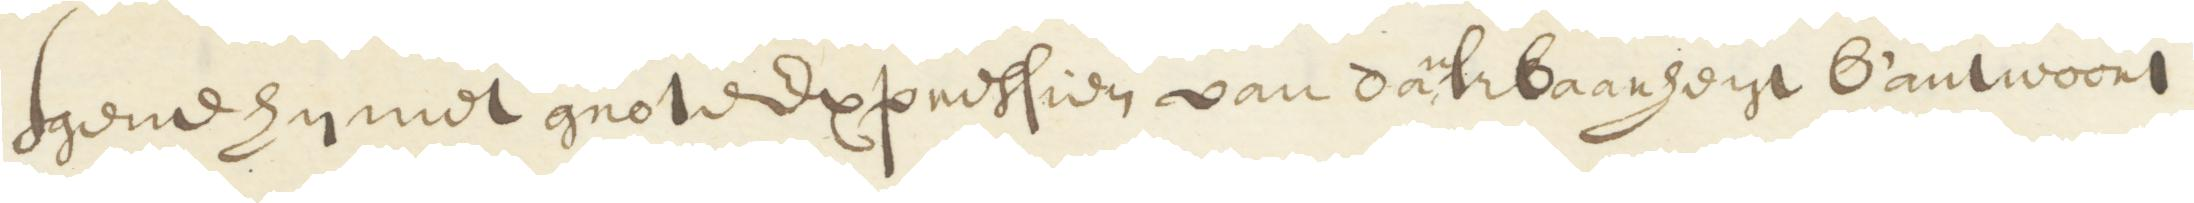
tgene hij met grote Expressien van dankbaarheijt b'antwoort
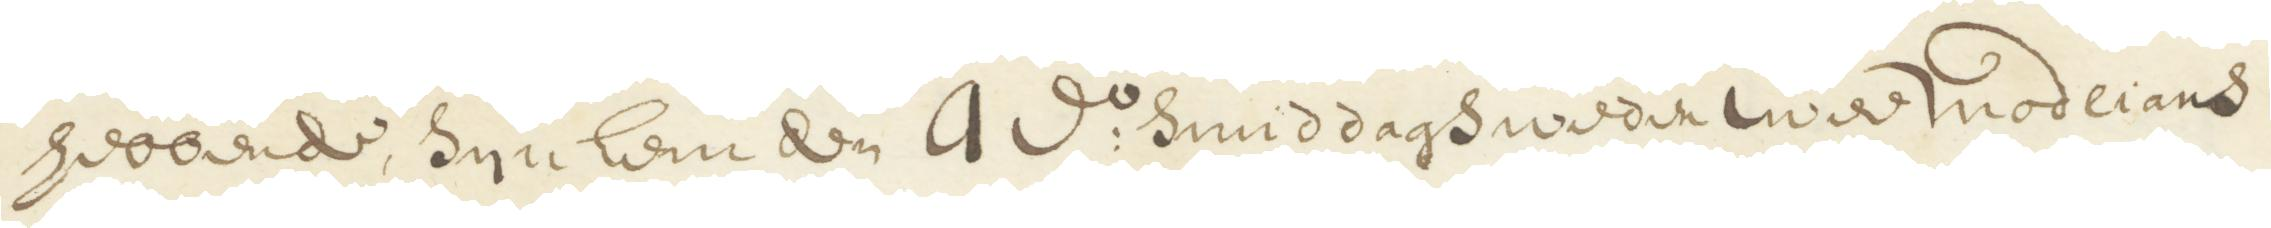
hebbende, sijn hem den 4 d:o smiddags weder twee modliars
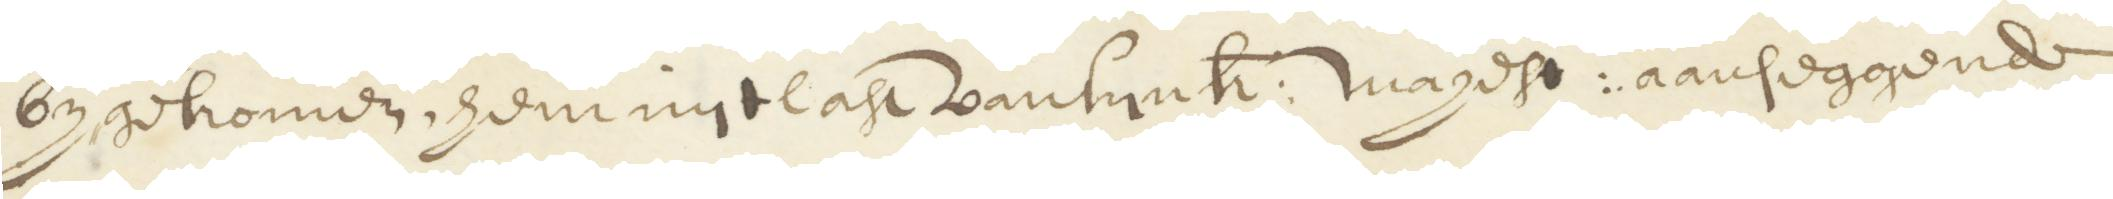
bij hem gekomen, hem uyt last vansyn k: majest:t aanseggende
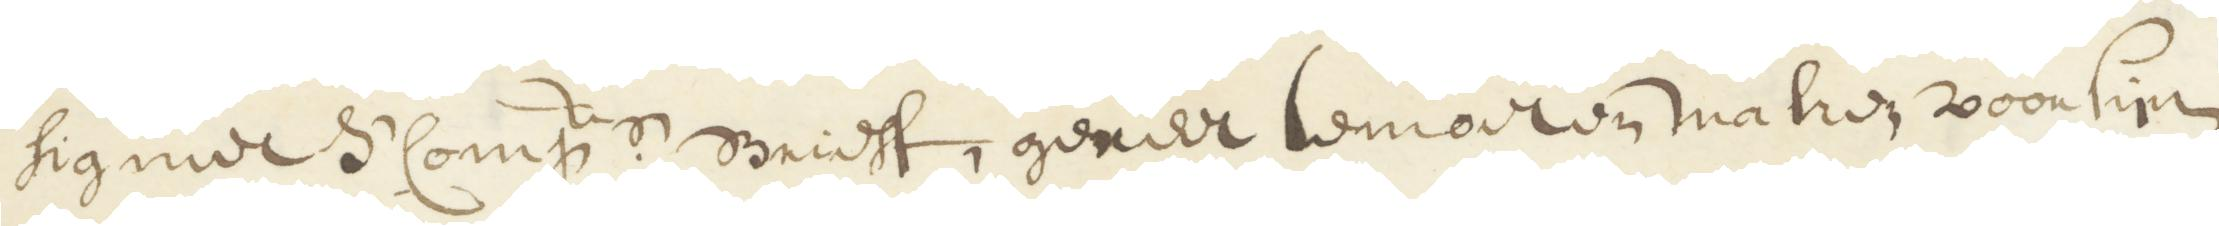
sig met s'Comp:s Brieff, gereet temoeten maken voor sijn
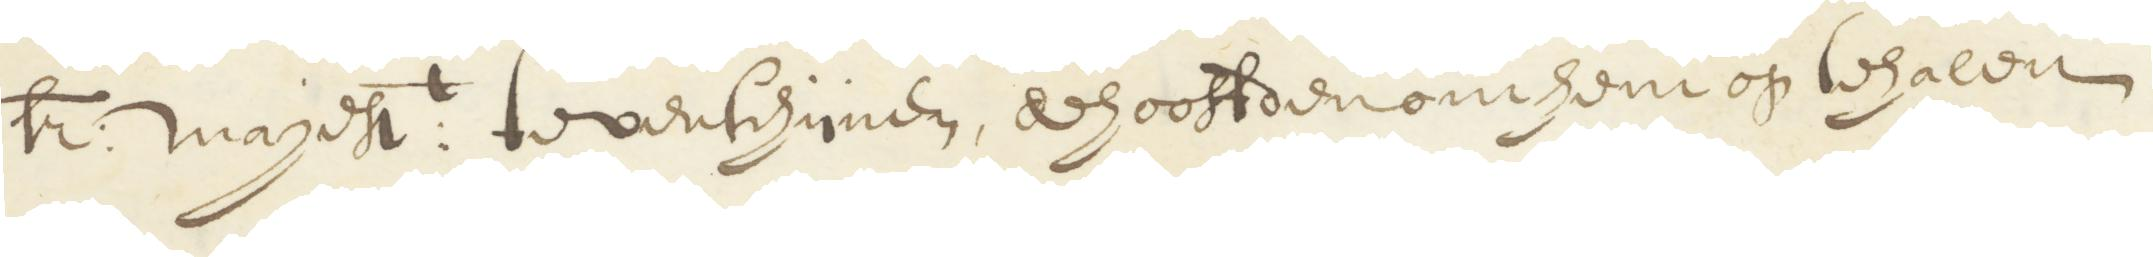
k: majest:t teverschijnen, dehooffden om hem op tehalen
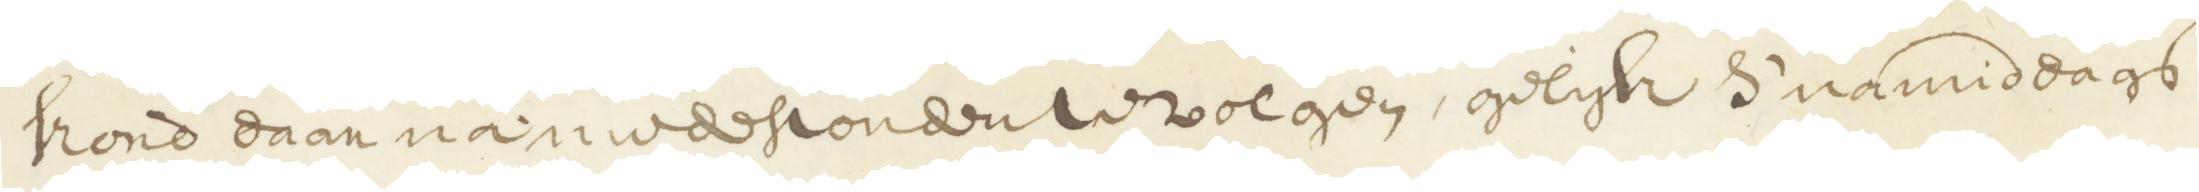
kord daar na medestondentevolgen, gelijk s'namiddags
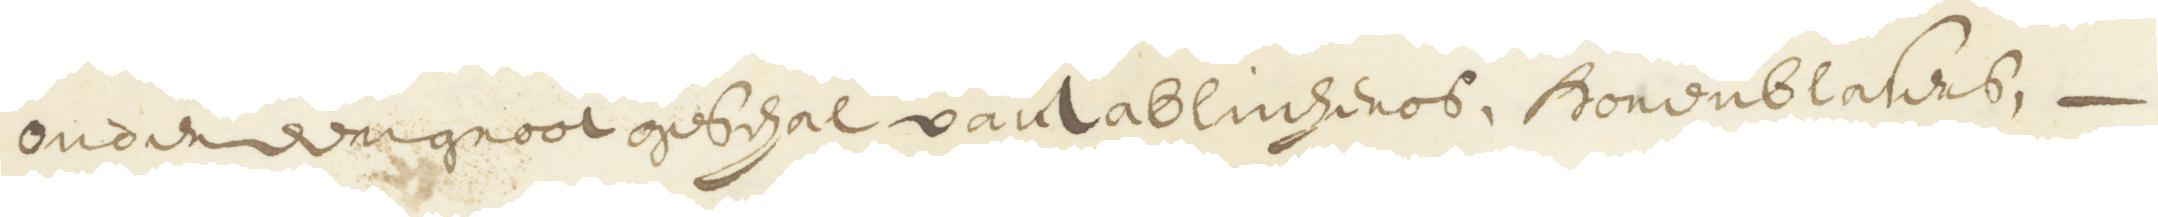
onder een groot geschal van t ablinheros, Horenblasers, —
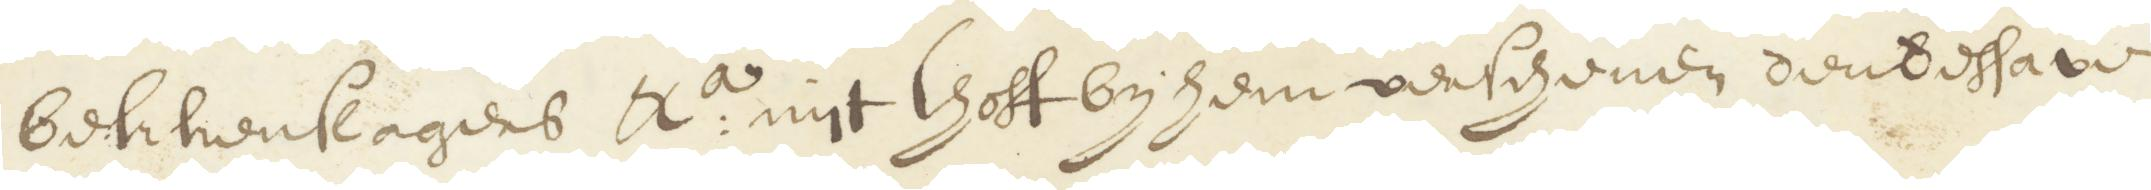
bekkenslagers &:a uijt thoff bij hem verschenen den dessave
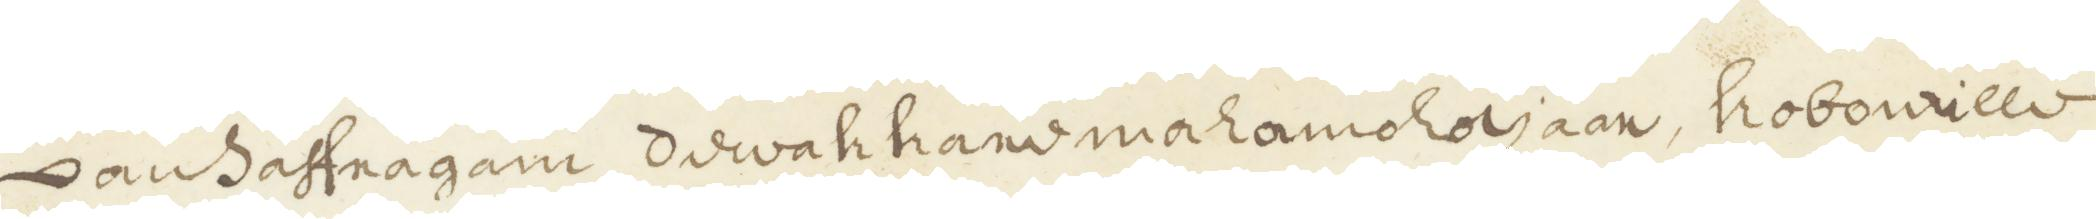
van saffragam dewakkare mahamohotjaar, kobowille
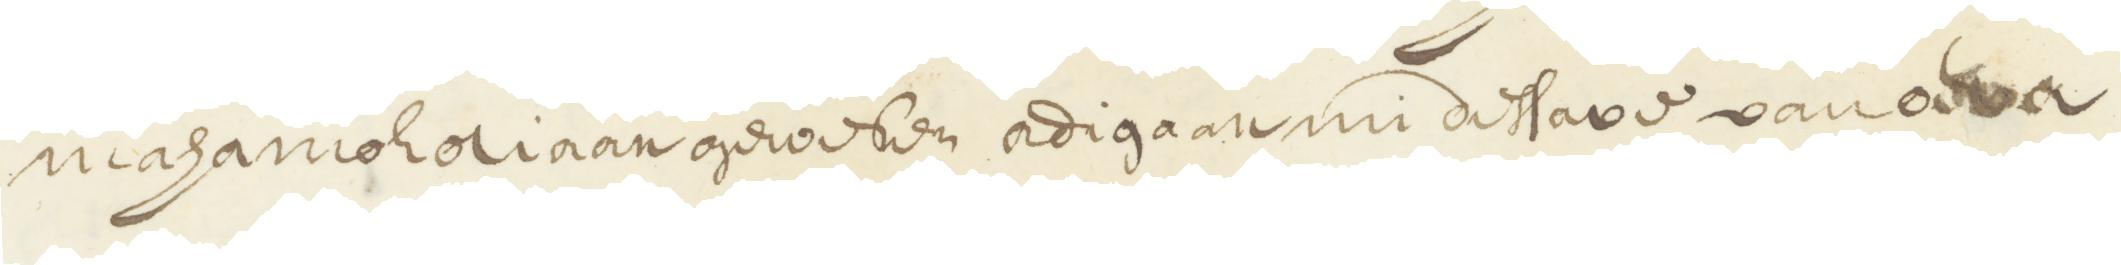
mahamohotiaar gewesen adigaan nu dessave van oera
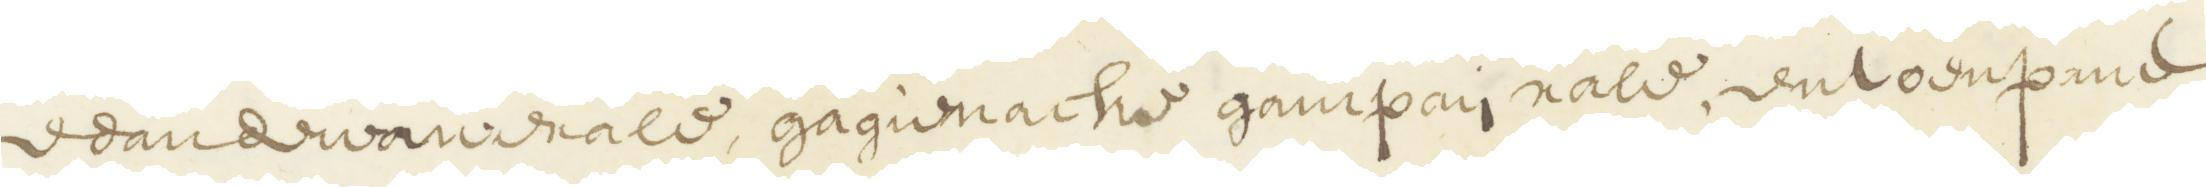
edandewawerale, gagienacke gampaij rale, entoerpme
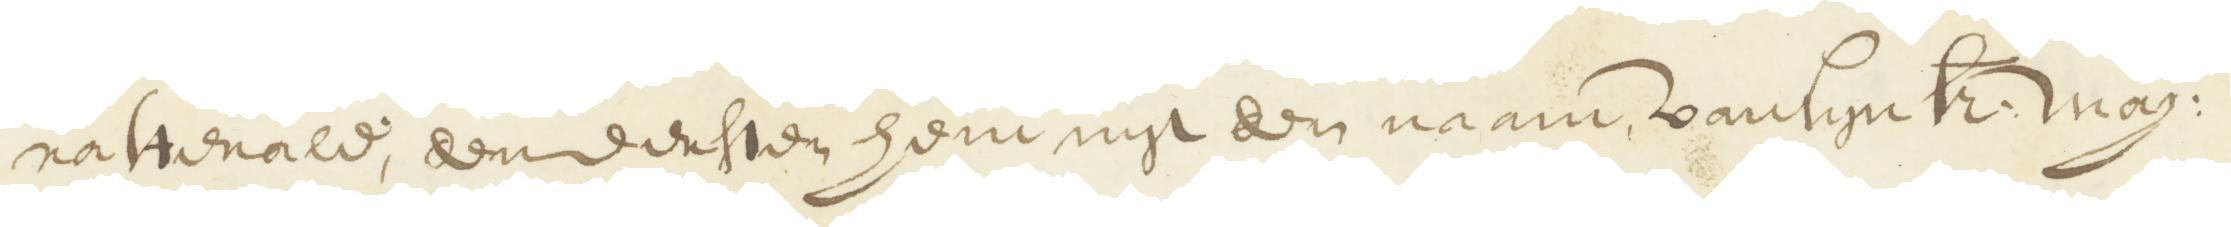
ratterale, den eersten hem uijt den naam, vansijn k: maj:t
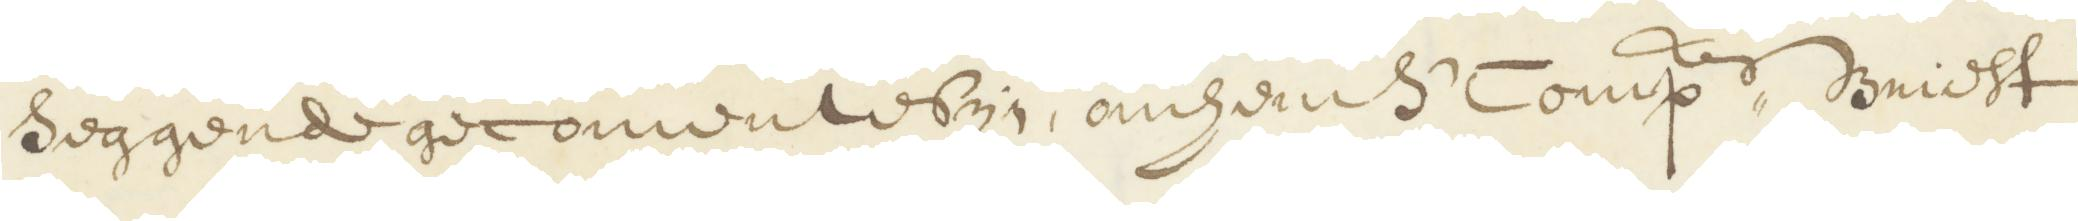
seggende gecomen te sijn, omhem s'Comp„s Brieff
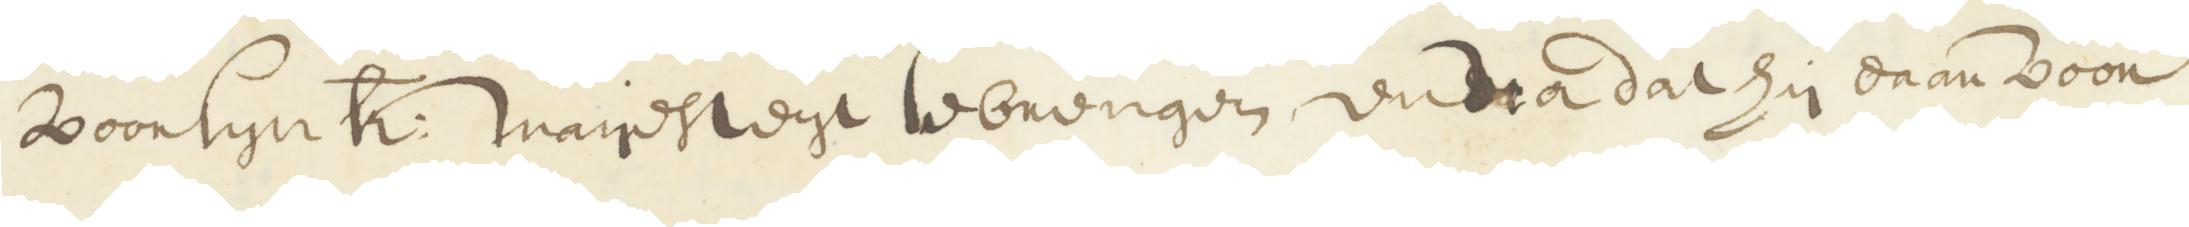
voorsijn k: maijesteijt tebrengen endra dat hij daar voor
